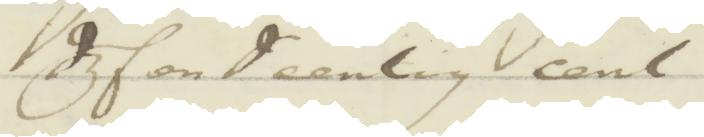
Vyf en Veertig cent
